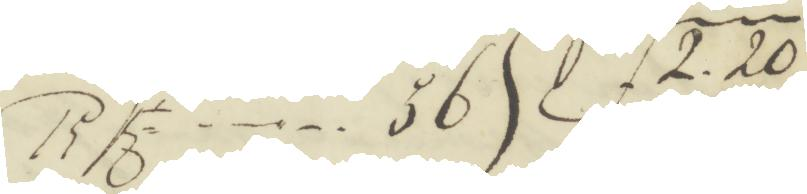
15 /C=t - - - „ – . 56 ƒ2. 20
